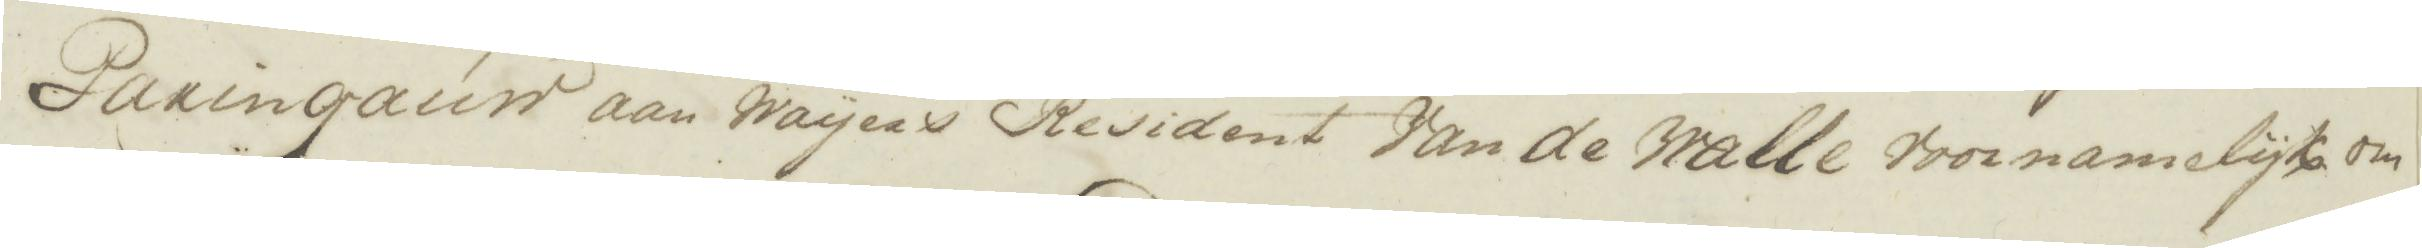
Paringauw aan waijers Resident van de walle voornamelijk om
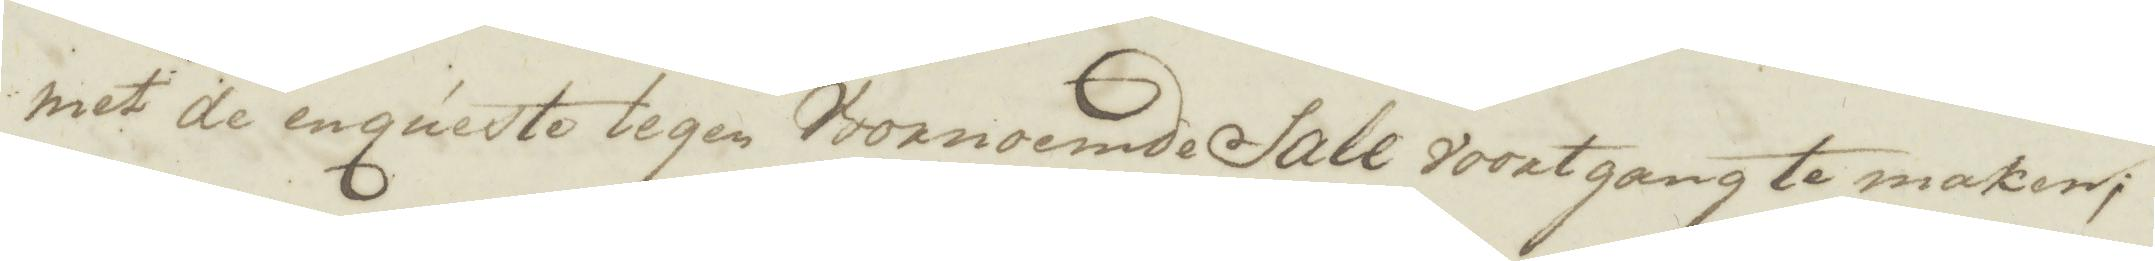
met de enqueste tegen voornoemde sale voortgang te maken;
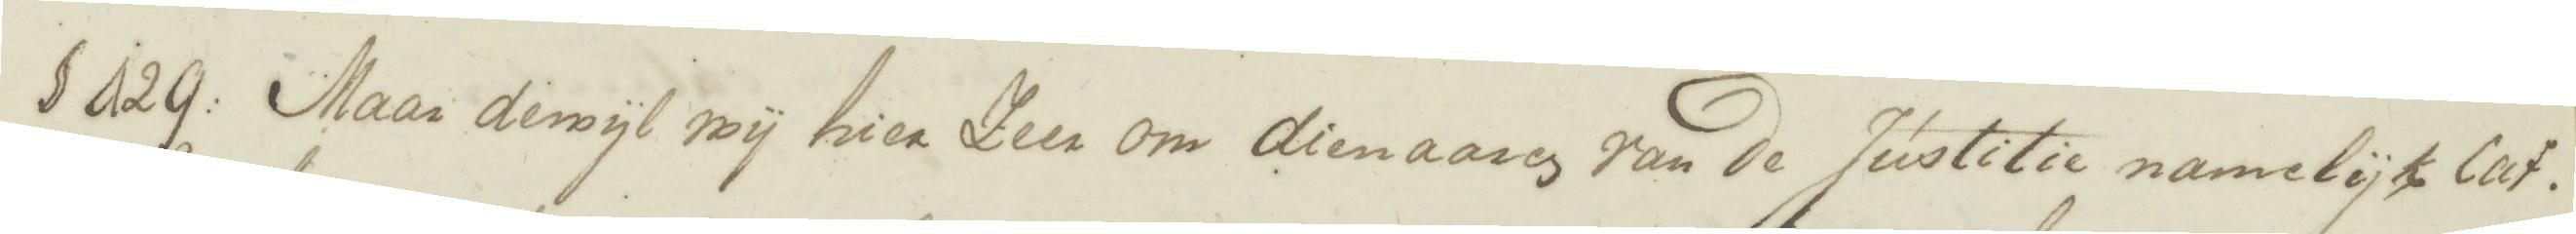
§429: Maar dewijl wij hier zeer om dienaaren van de Justitie namelijk Caf.
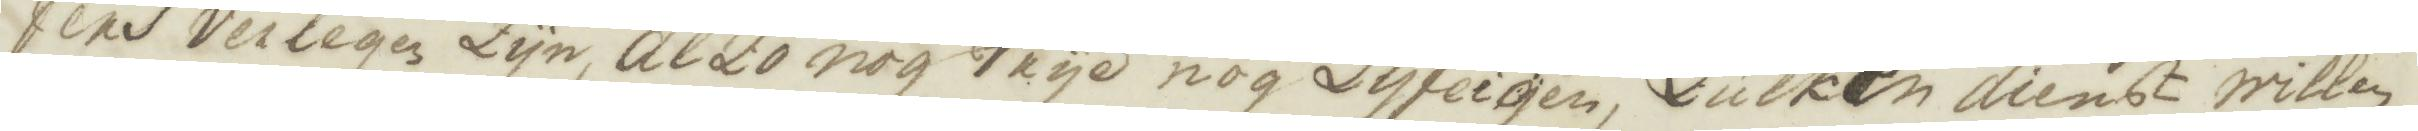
fers verlegen zijn, alzo nog vrije nog lijfeigen, zulken dienst willen
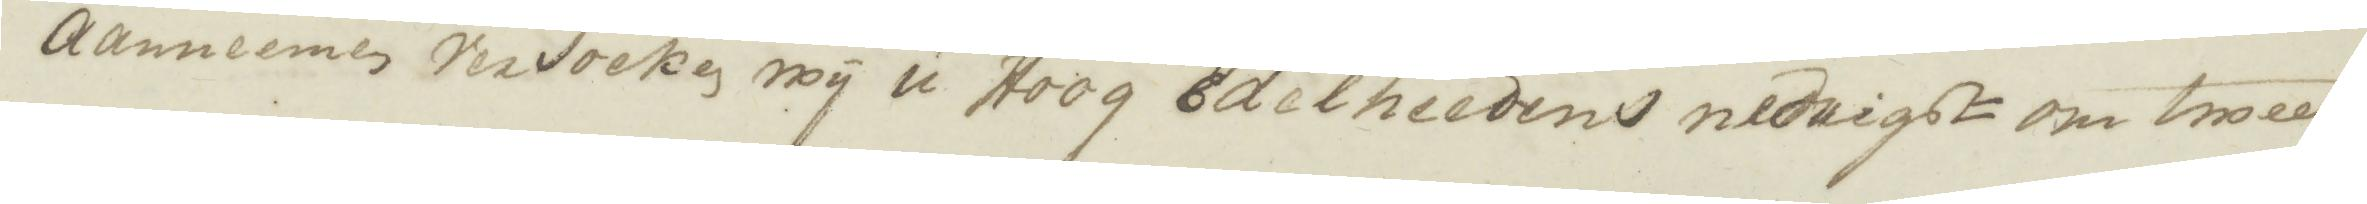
aanneemen versoeken wij u Hoog Edelheedens nedrigst om twee
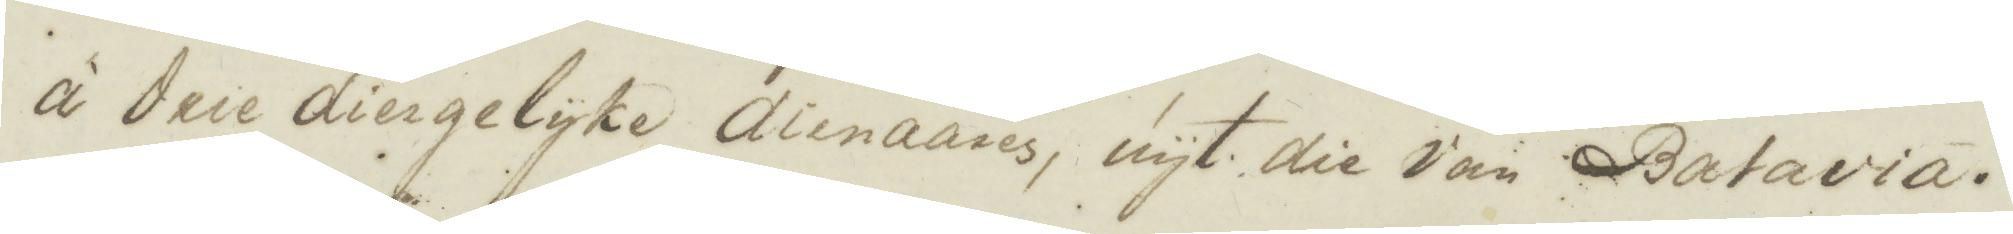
à drie diergelijke dienaaren, uijt die van Batavia.
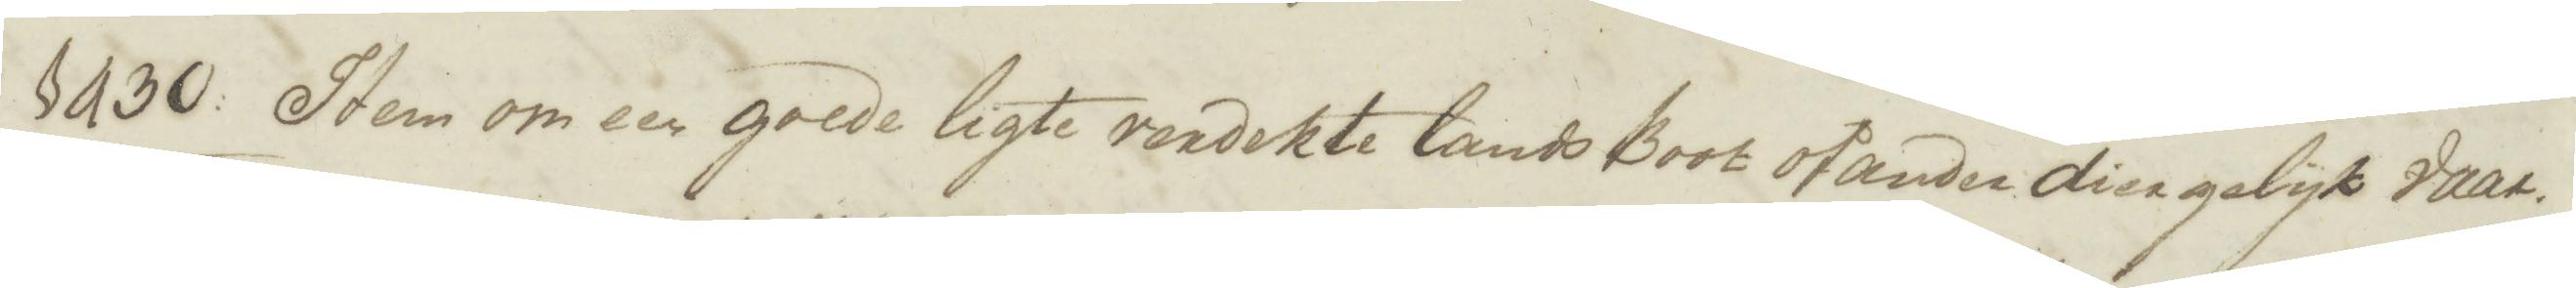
§430: Item om een goede ligte verdekte lands Boot of ander diergelijk vaar„
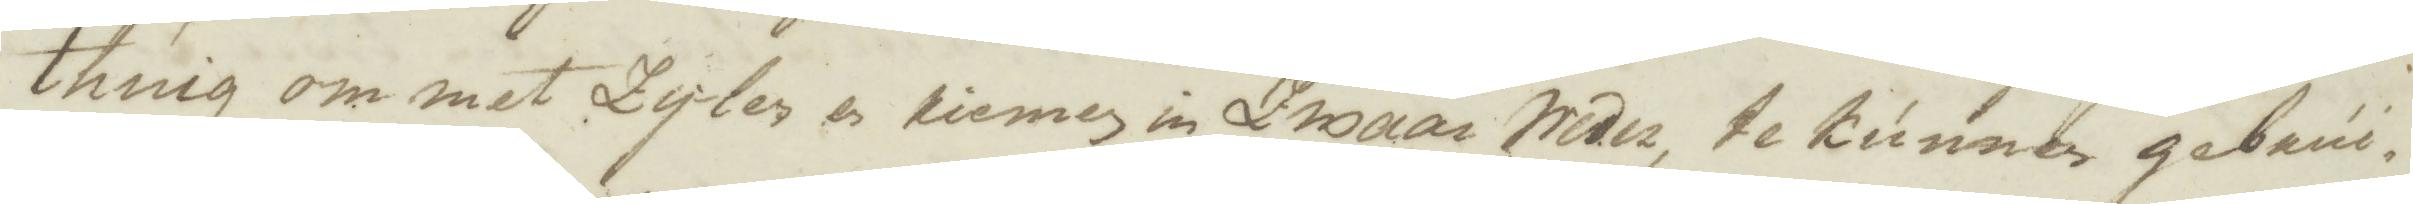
thuig om met zylen en riemen in zwaar weder, te kunnen gebrui„
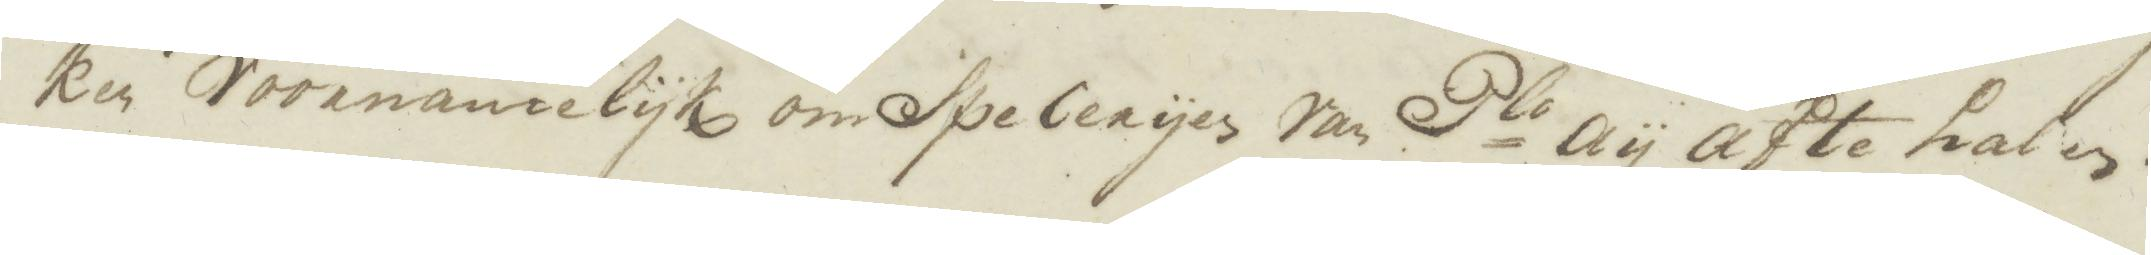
ken voornamelijk om specerijen van P=lo aij af te halen
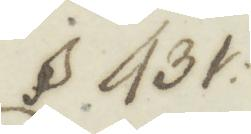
§ 431
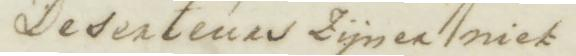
Deserteurs zijn er niet
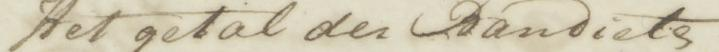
Het getal der Bandieten
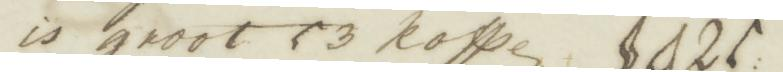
is groot 53 koppen §425:
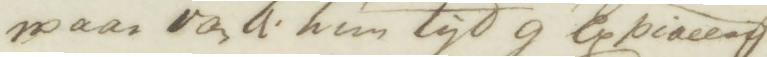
waar van 4: hun tijd g’Expireerd
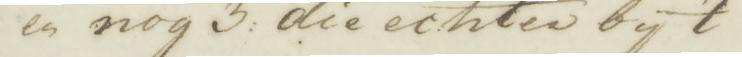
en nog 3: die echter bij ’t
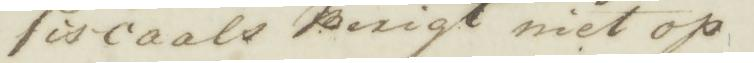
fiscaals Berigt niet op
